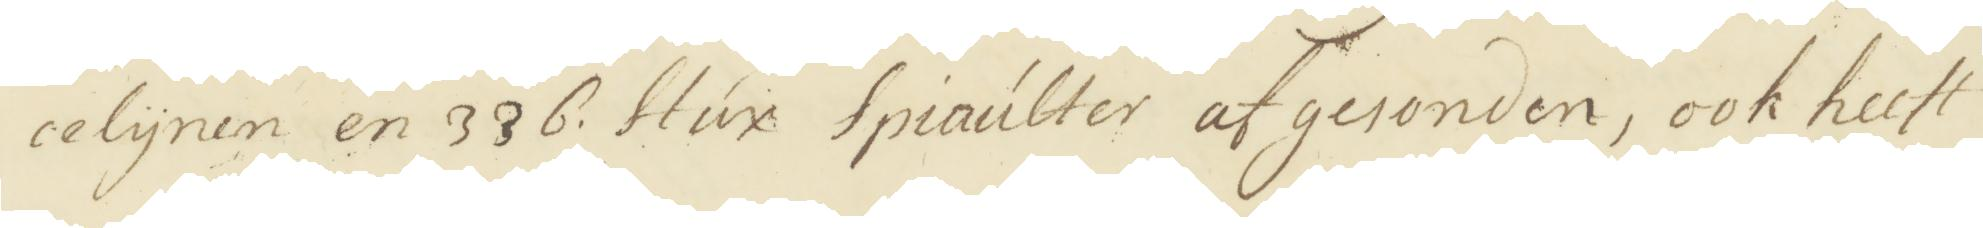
celijnen en 336. stux spiaulter afgesonden, ook heeft
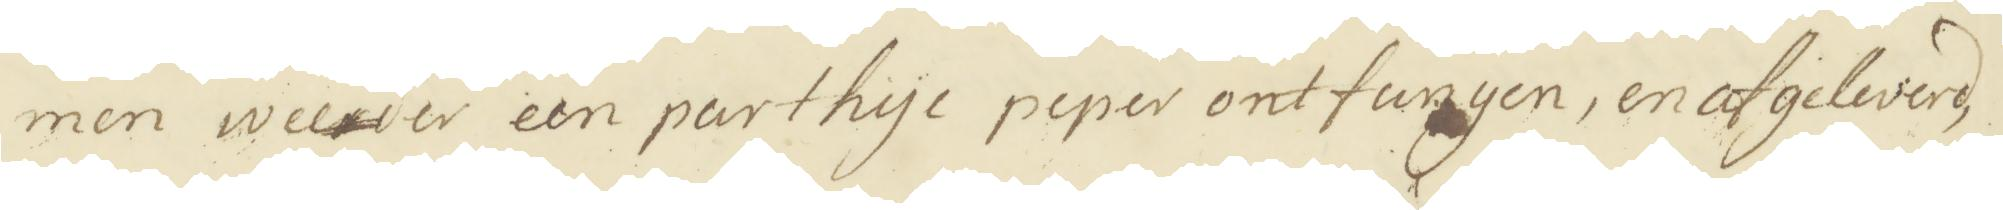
men weeder een parthije peper ontfangen, en afgeleverd,
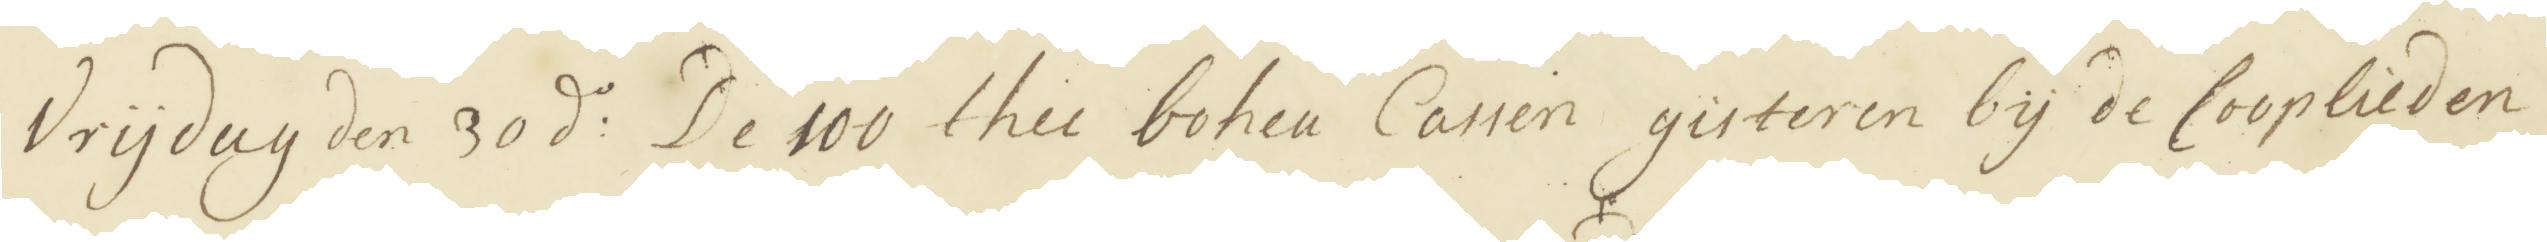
Vrijday den 30 d:o De 100 thee bohea Cassen gisteren bij de Cooplieden
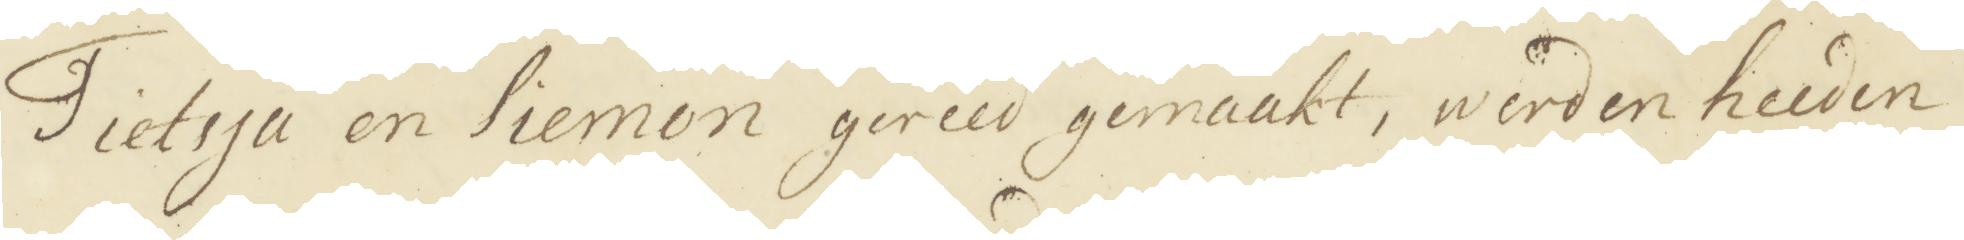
Tietsja en Siemon gereed gemaakt, werden heeden
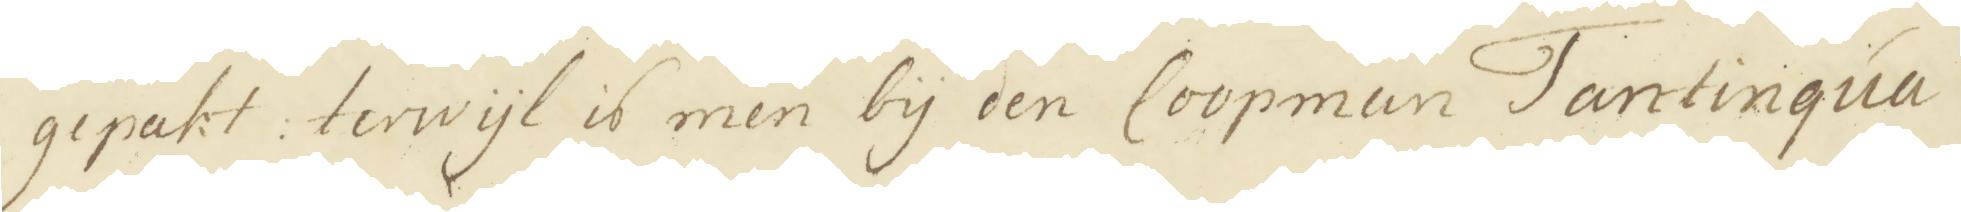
gepakt: terwijl is men bij den Coopman Tantinqua
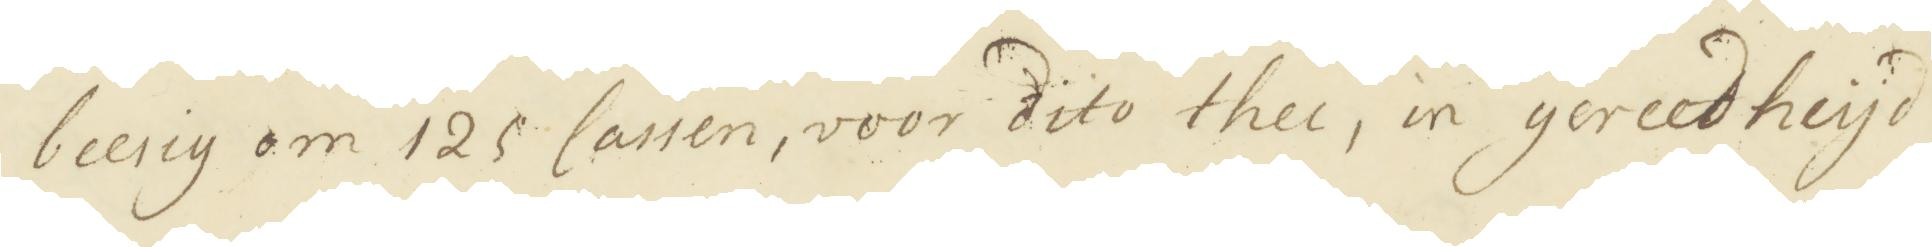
beesig om 125 Cassen, voor dito thee, in gereedheijd
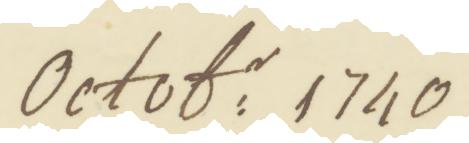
Octob:r 1740
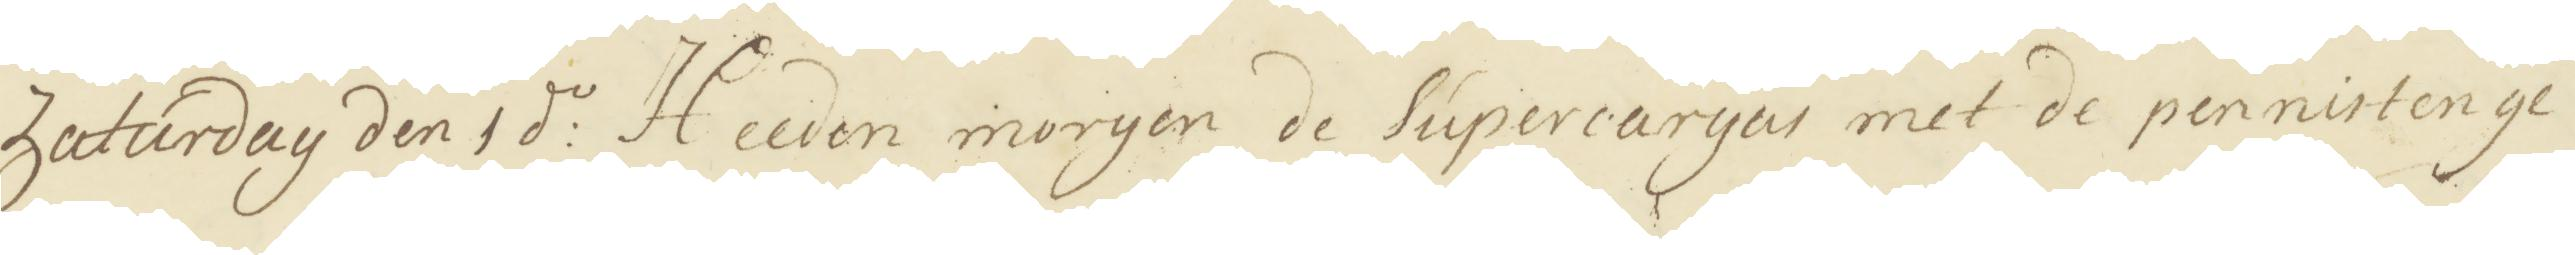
Zaturdag den 1 d:o Heeden morgen de supercargas met de pennisten ge
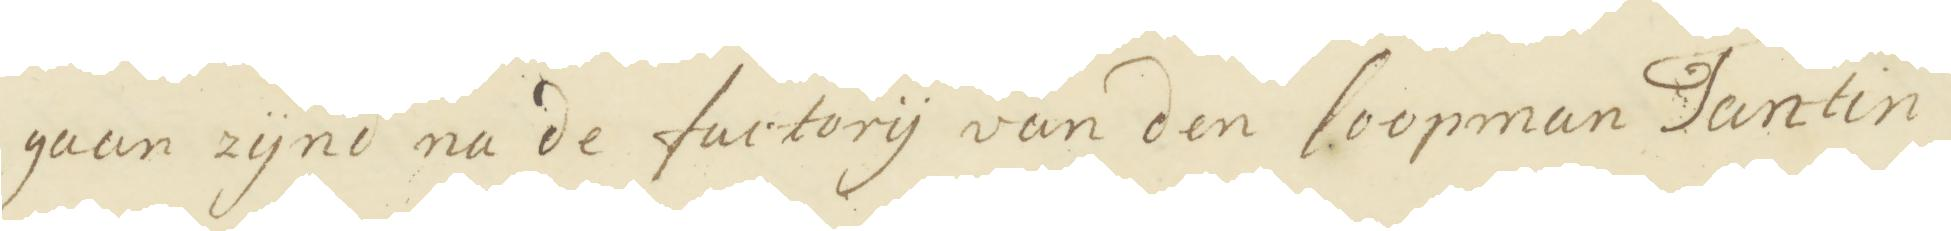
gaan zijnd na de factorij van den Coopman Tantin
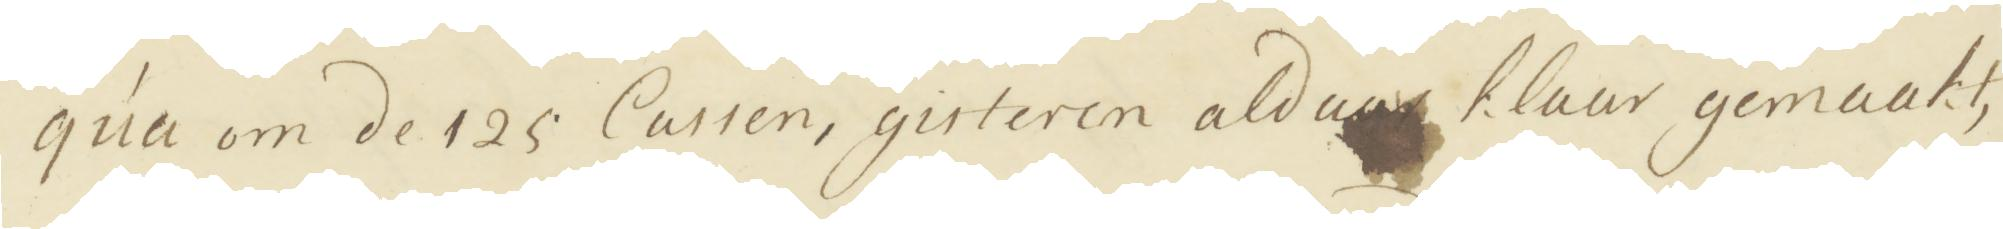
qua om de 125 Cassen, gisteren aldaar klaar gemaakt,
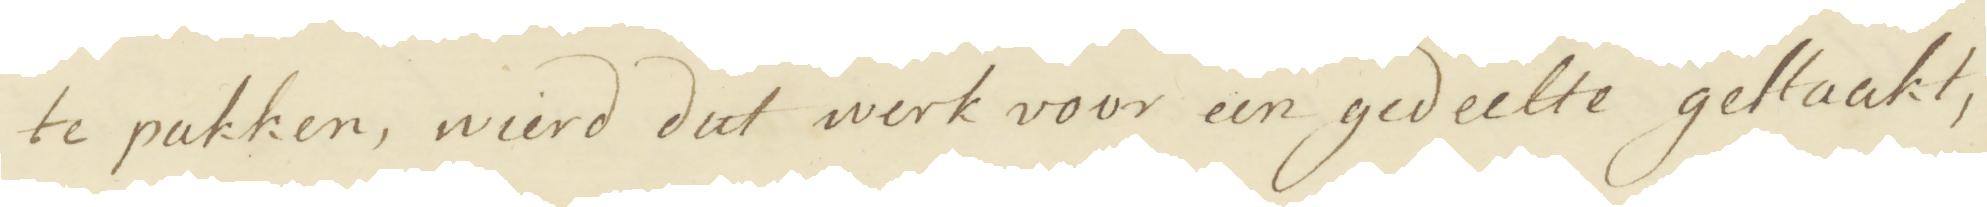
te pakken, wierd dat werk voor een gedeelte gestaakt,
